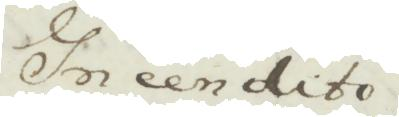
In een dito
